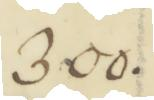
300.
